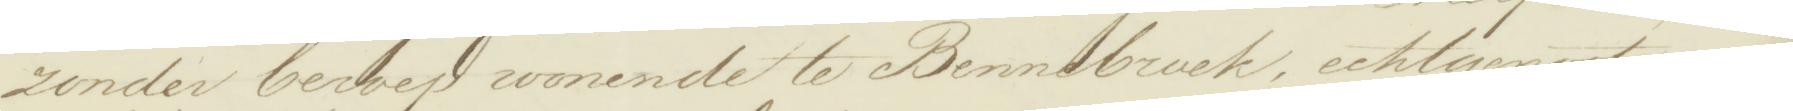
zonder beroed wonende te Bennebroek, echtgenoote van
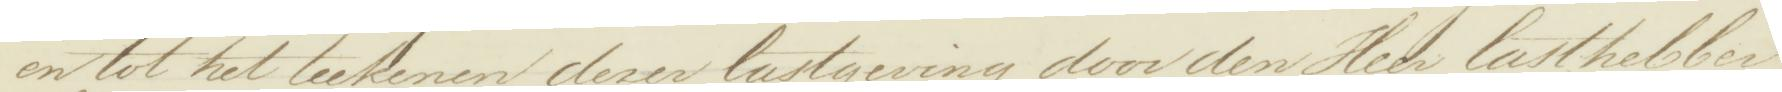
en tot het teekenen dezer lastgeving door den Heer lasthebber
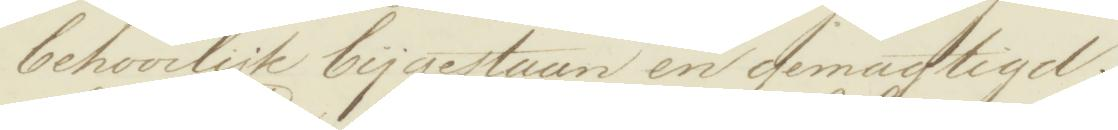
behoorlijk bij gestaan en gemagtigd
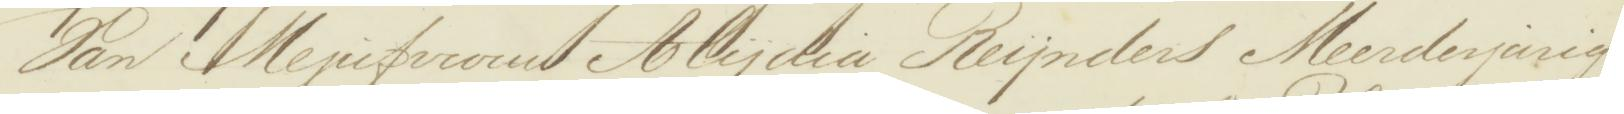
b Van Mejufvrouw Alijdia Reijnders Meerderjarig
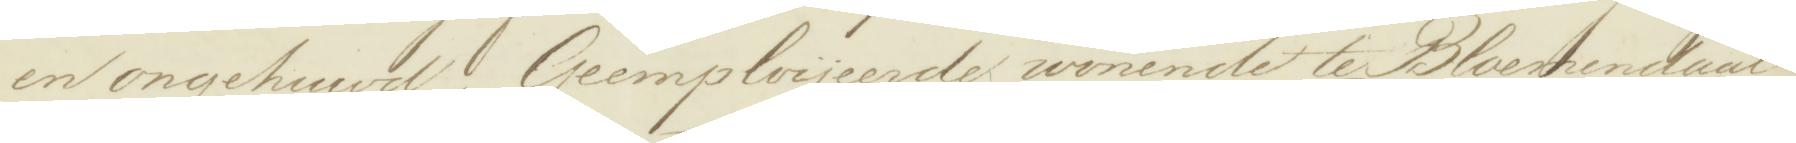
en ongehuwd, Geemploijeerde wonende te Bloemendaal
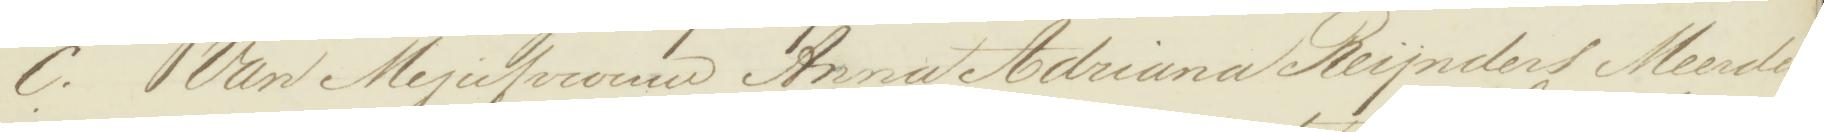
c. Van Mejufvrouw Anna Adriana Reijnders Meerder
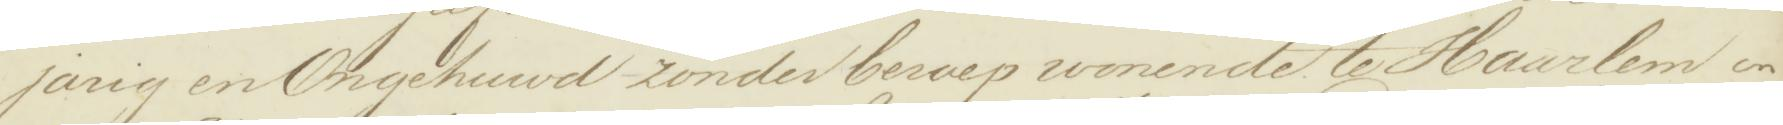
jarig en Ongehuwd zonder beroep wonende te Haarlem en
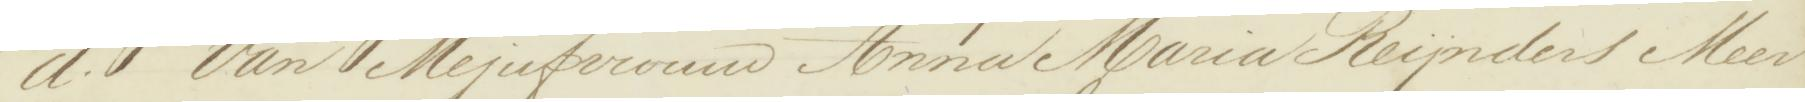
d. Van Mejufvrouw Anna Maria Reijnders Meer
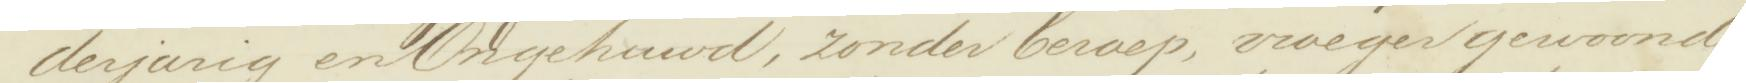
derjarig en Ongehuwd, zonder beroep, vroeger gewoond
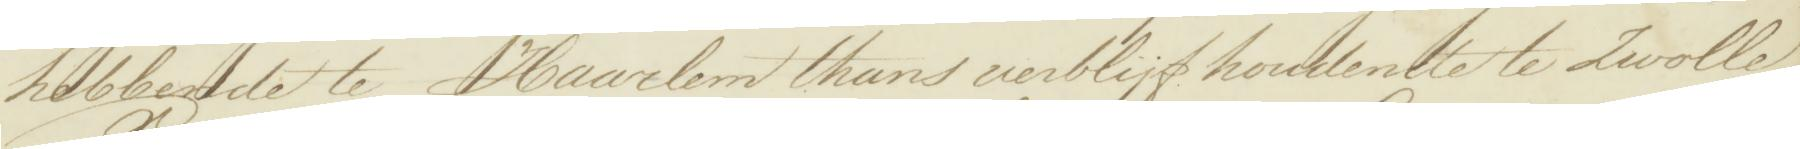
hebbende te Haarlem thans verblijf houdende te Zwolle
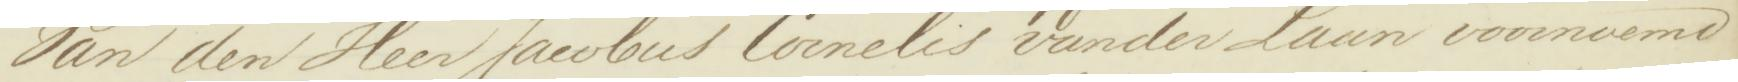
Van den Heer Jacobus Cornelis vander Laan voornoemd
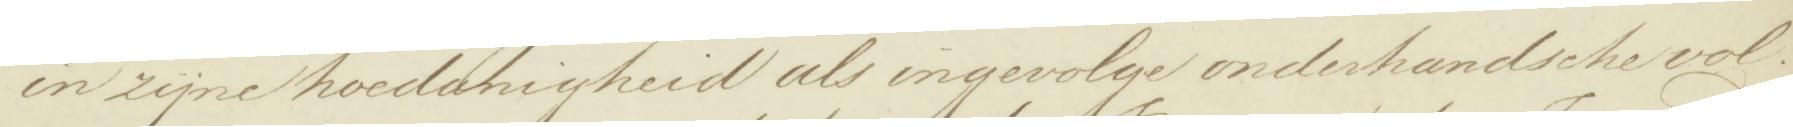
in zijne hoedanigheid als ingevolge onderhandsche vol„
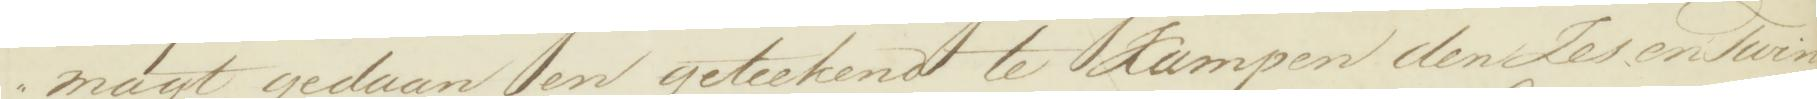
„magt gedaan en geteekend te Kampen den Zes en Twin
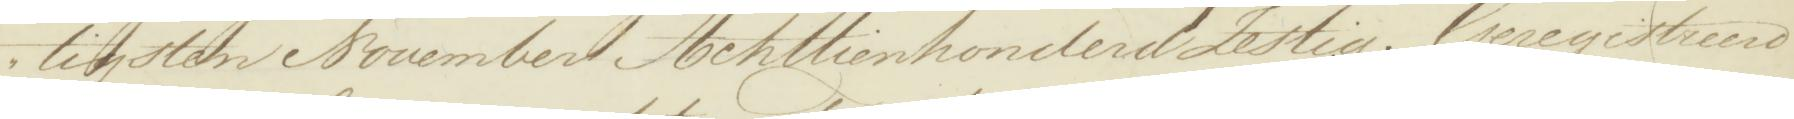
„tigsten November Achttienhonderd Zestig. Geregistreerd
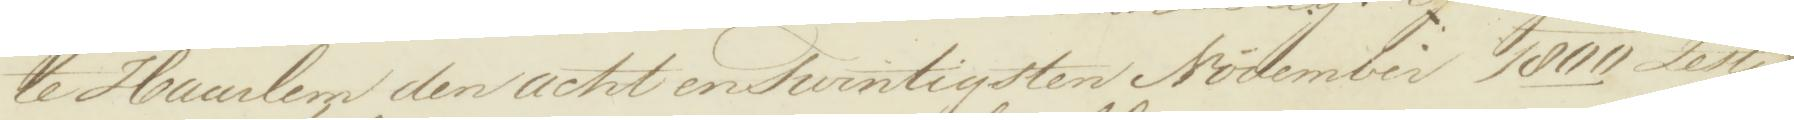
te Haarlem den acht en Twintigsten November 1800, Zestig
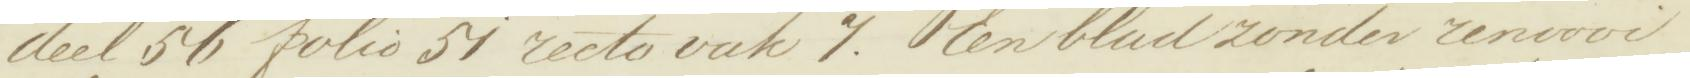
deel 56 folio 51 recto vak 7. Een blad zonder renvooi
